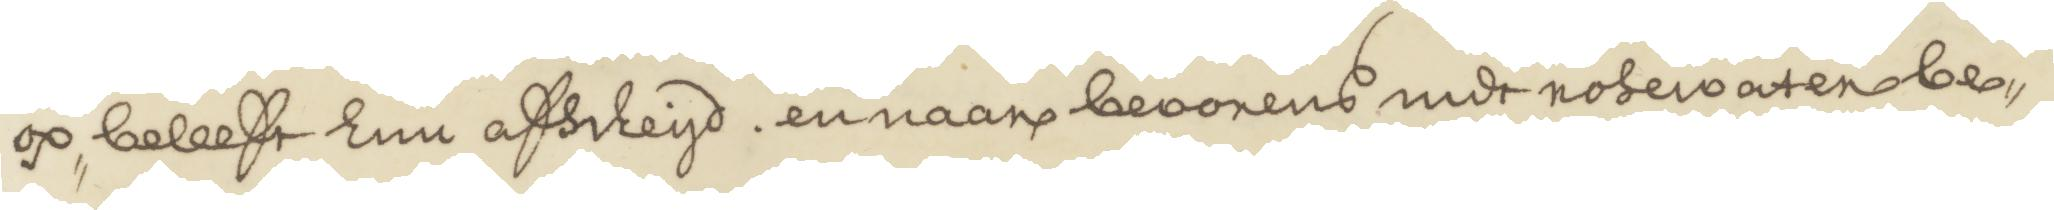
op„ beleeft hun afscheijd en naar bevorens met rosewater be„
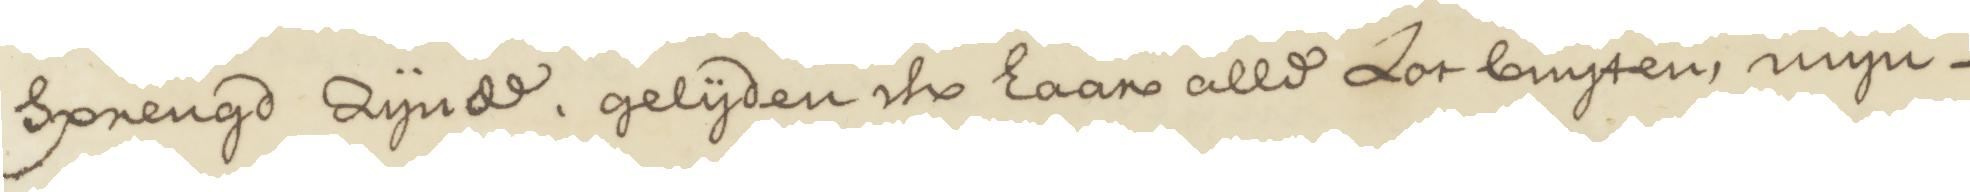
sprengd zijnde, gelijden ik haar alle tot buijten, mijn
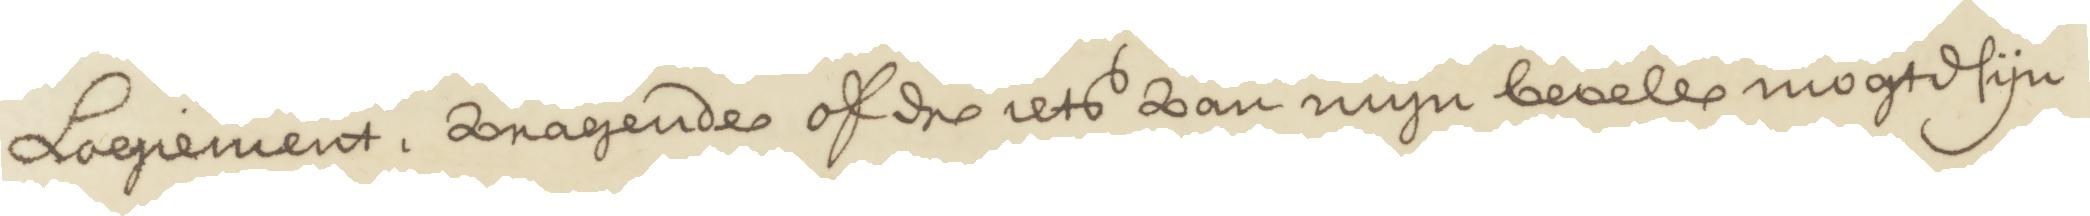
Logiement, vragende of er iets van mijn bevele mogtesijn
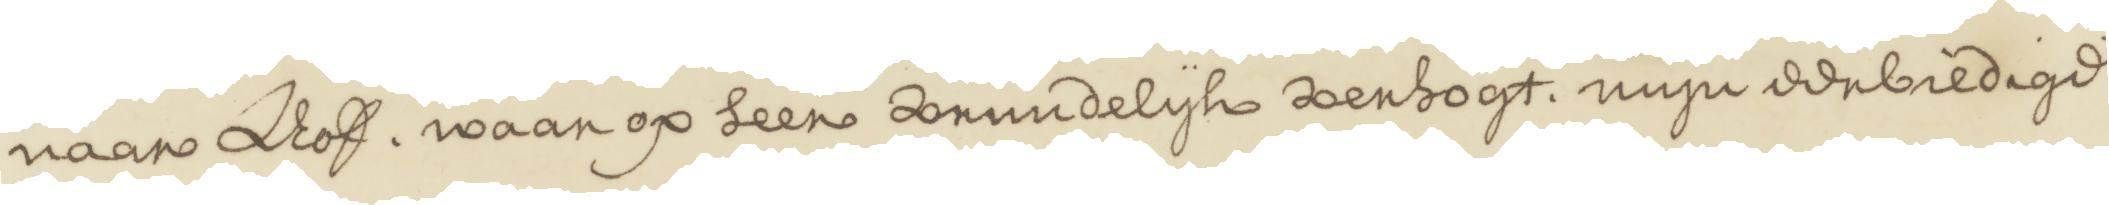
naar thof, waar op seer vrundelijk versogt. mijn eerbiedige
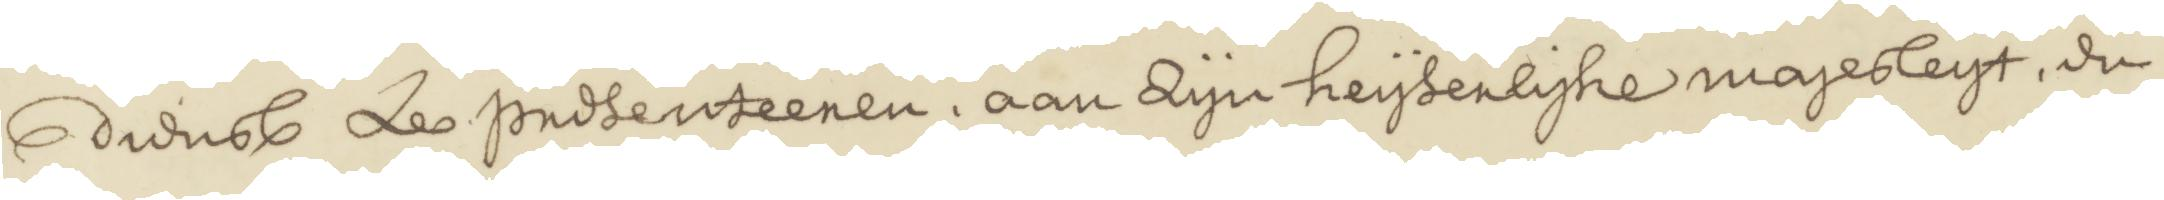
dienst te presenteeren, aan zijn keijserlijke majesteijt, en
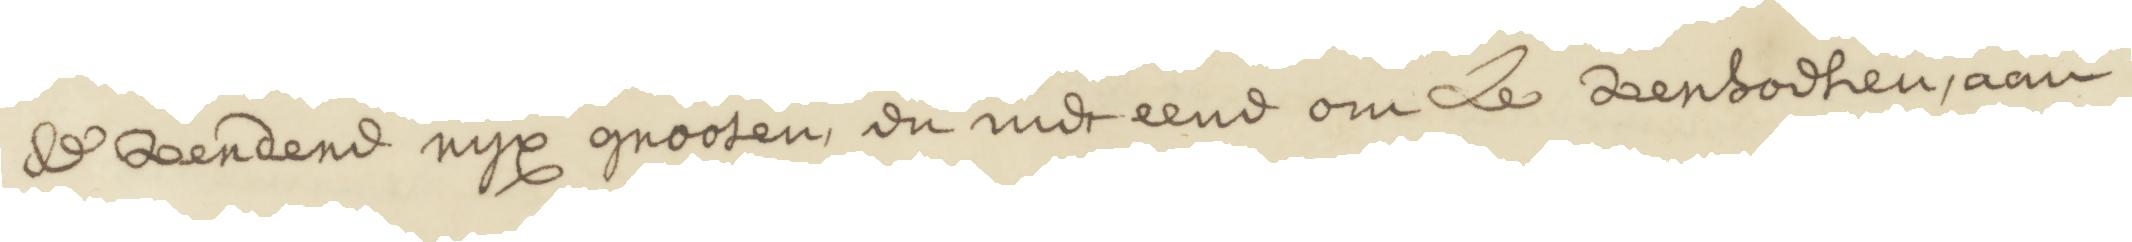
de verdere rijx grooten, en met eene om te versoeken, aan
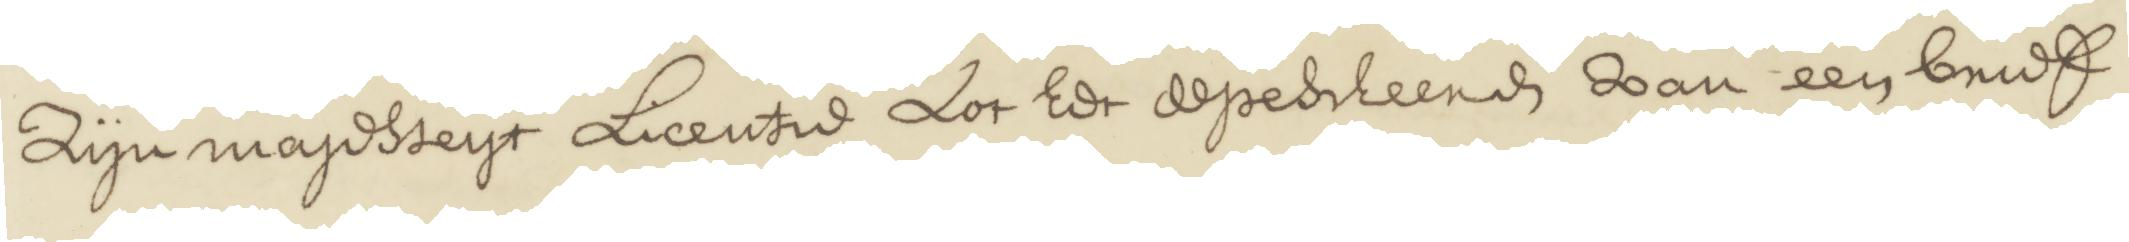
zijn majesteijt Licentie tot het depescheeren van een brief
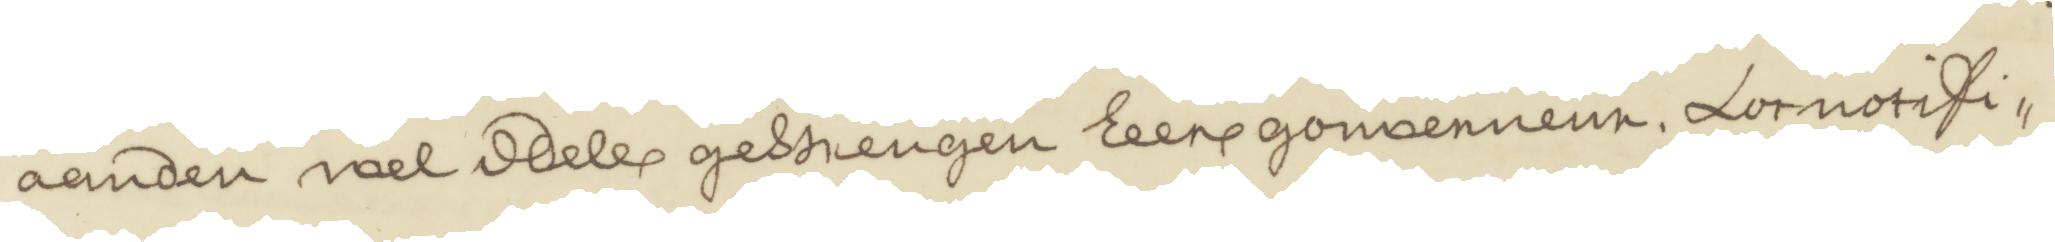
aanden wel Edele gestrengen heer gouverneur, tot notifi„
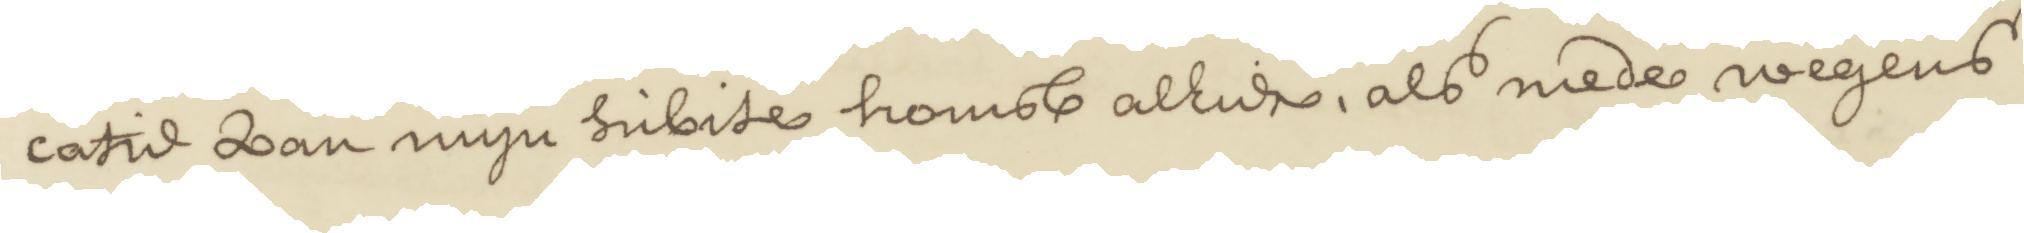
catie van mijn subite komst alhier, als mede wegens
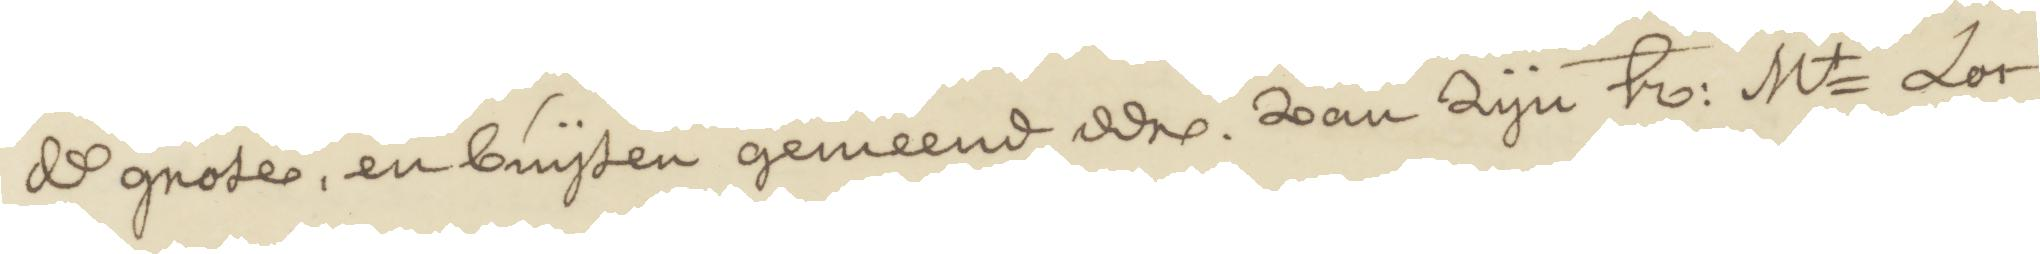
de grote, en buijten gemeene eer. van zijn k: M=t tot
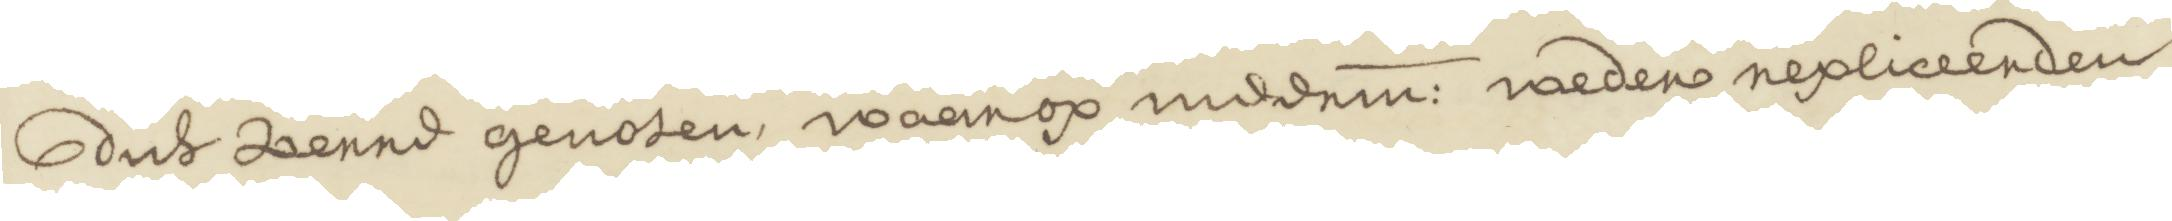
dus verre genoten, waar op meerm: weder repliceerden
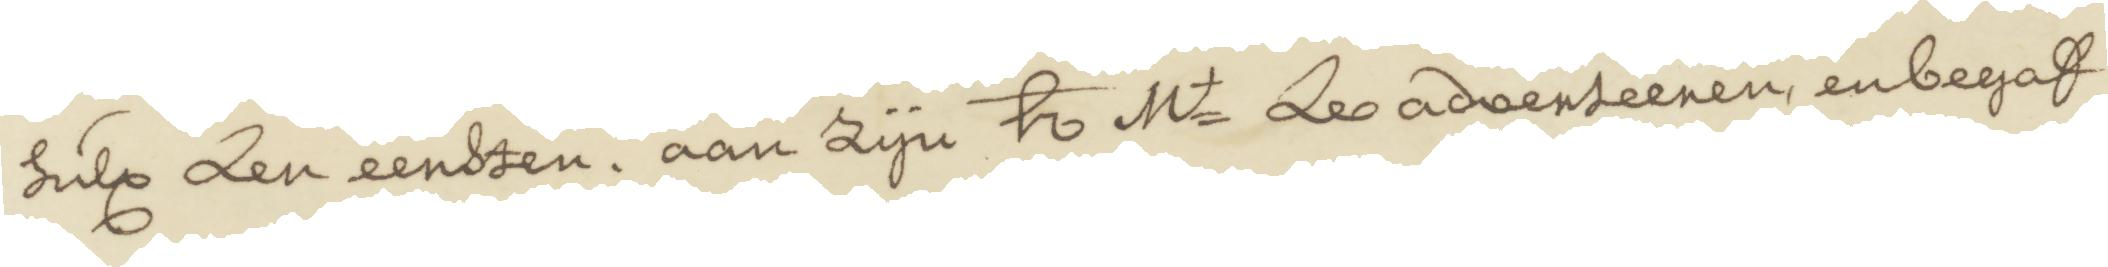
sulx ten eersten. aan zijn k M=t te adverteeren, en begaf
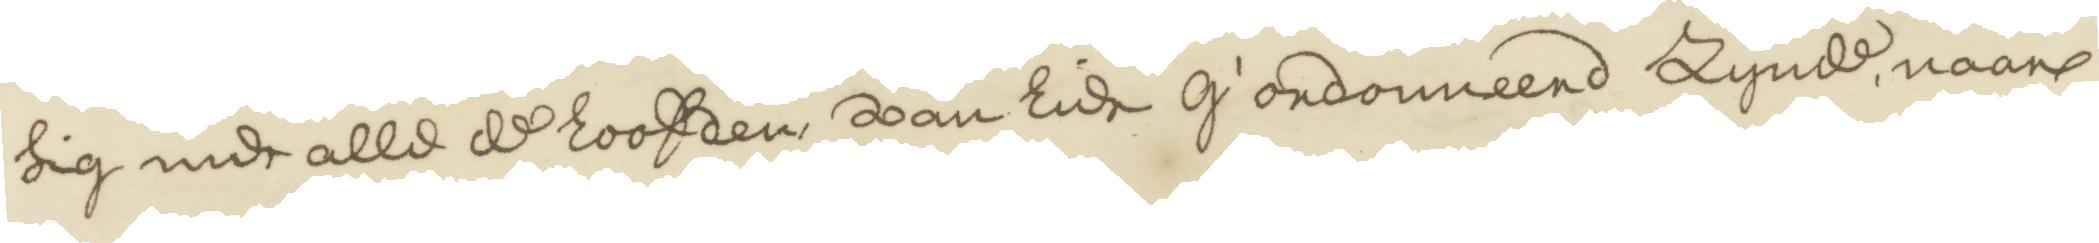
sig met alle de hoofden, van hier g’ordonneerd zijnde, naar
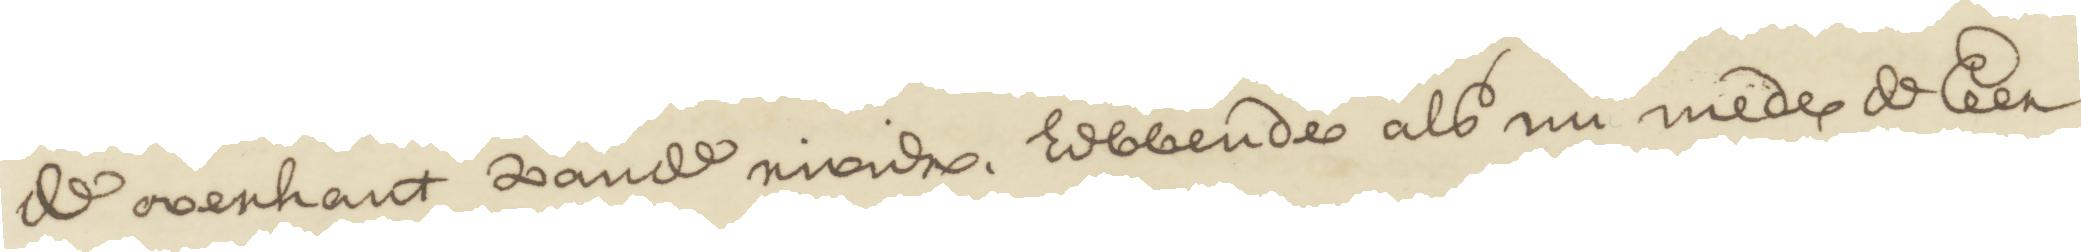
de overkant van de rivier, hebbende als nu mede de Eer
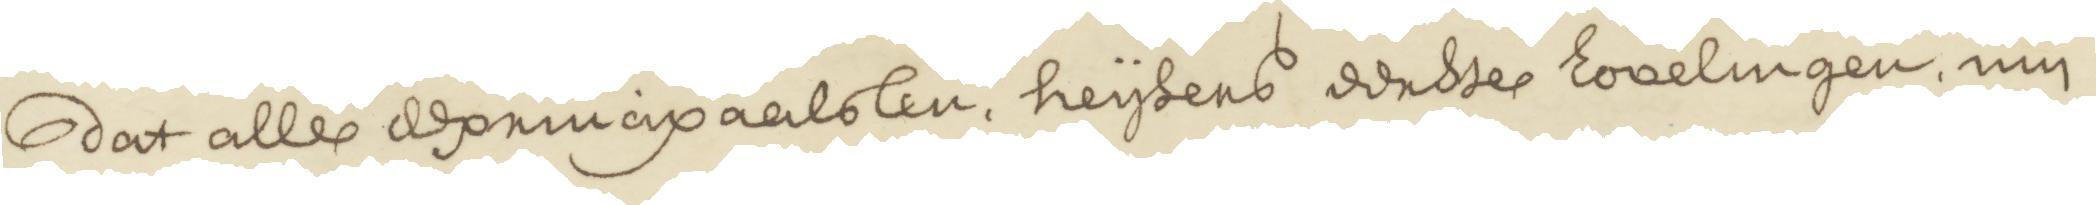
dat alle deprincipaalsten, keijsers eerste hovelingen, mij
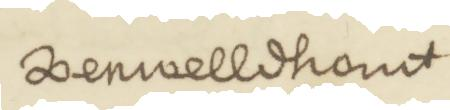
verwellekomt
